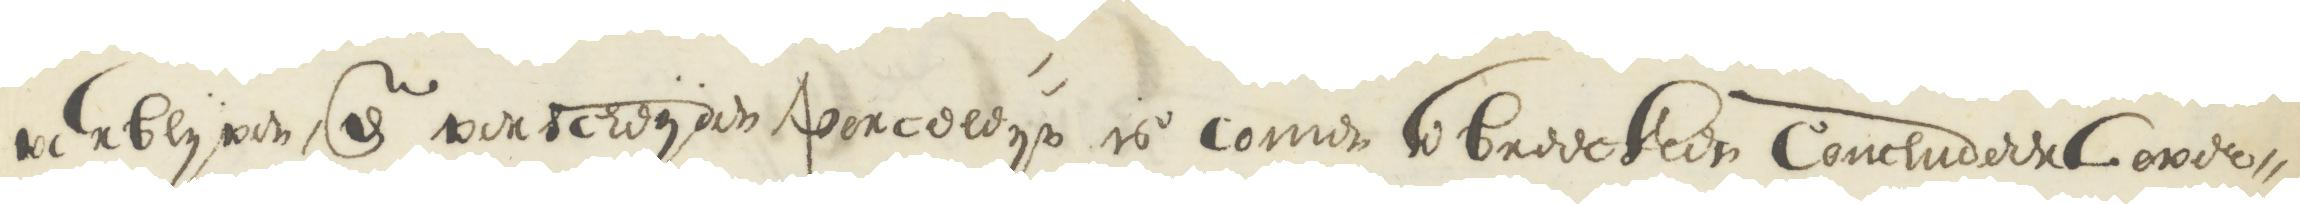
verblijven, ende verscheijden perceleijn is comen te breecken Concludeert over„
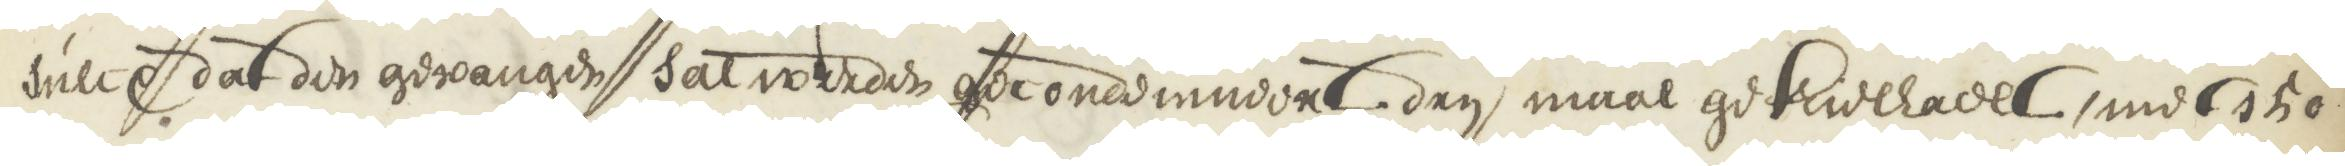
sulcx dat den gevangen sal werden gecondemneert drij maal gekielhaelt, met 150
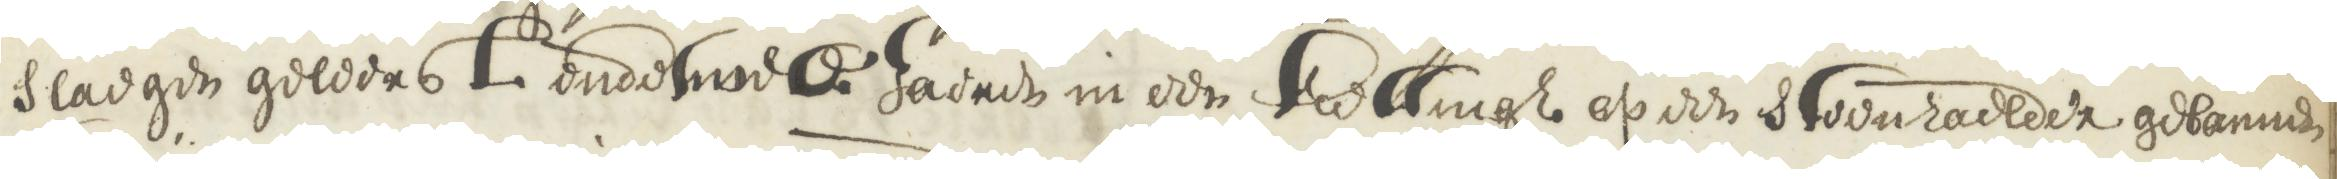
slaegen geleerst ende twee Jaeren in een kettingh op een steen haelder gebannen
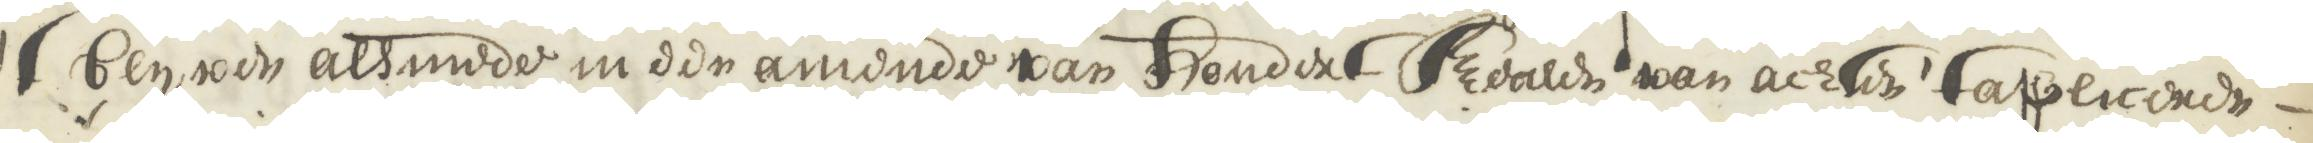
't blijven als mede in een amende van Hondert Realen van achten 't appliceren —
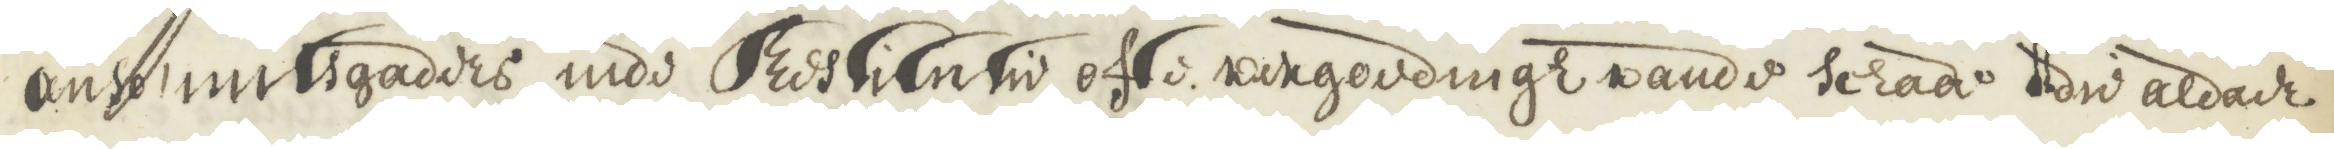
om so mitsgaders inde Restitutie ofte. vergoedingh vande schade die aldaer
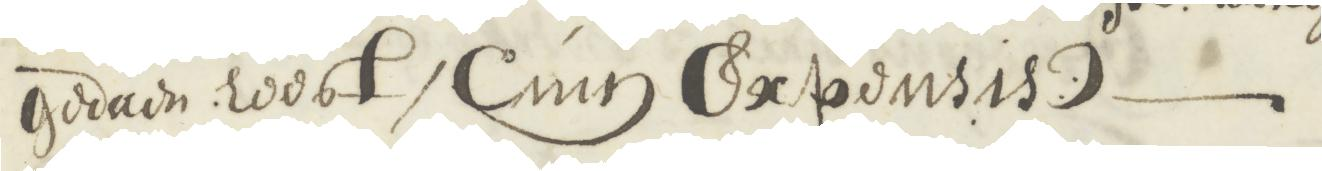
gedaen heeft / Cum Expensis :) —
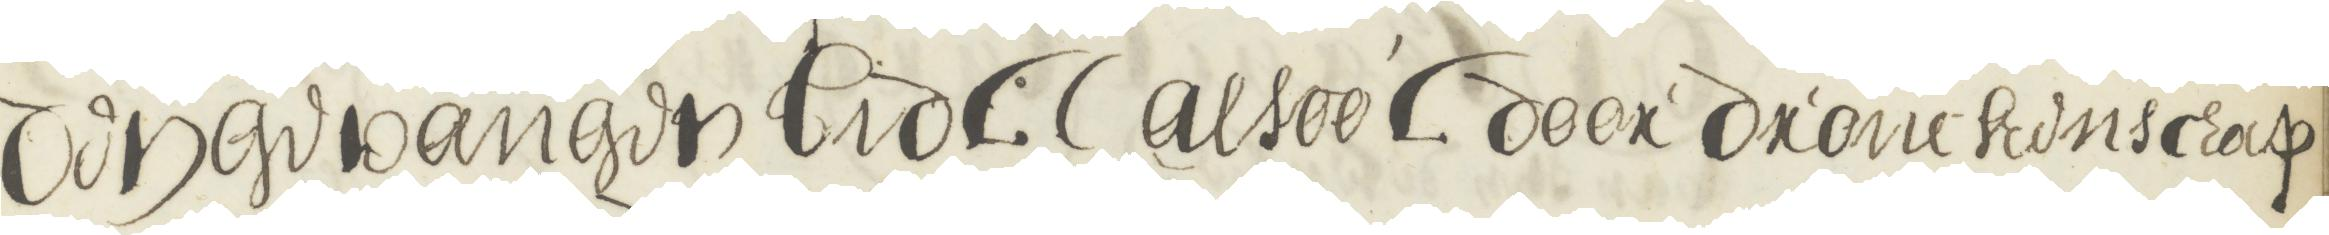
den gevangen bidt: ( alsoo 't door dronckenschap
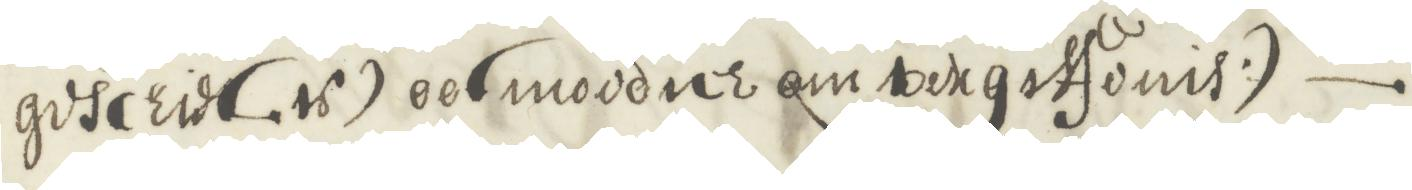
geschiet is) ootmoedich om vergiffenis:) —
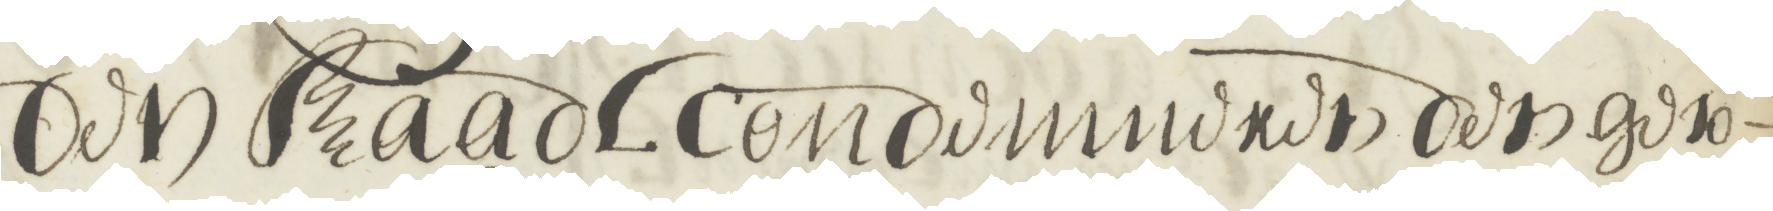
den Raadt condemneren, den gev=en
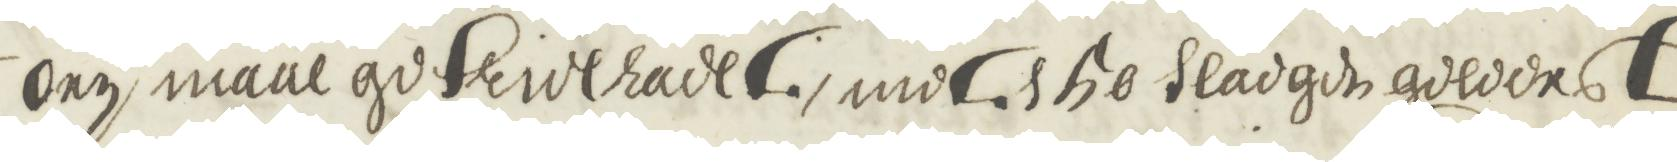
drij maal gekielhaelt, met 150 slaegen geleerst
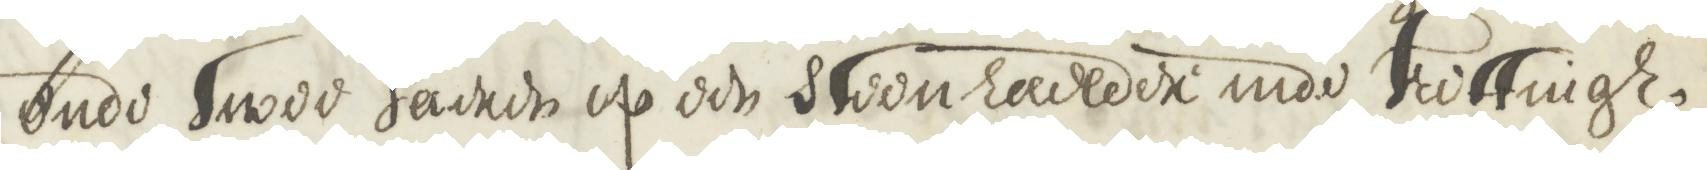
ende twee Jaeren op een steen haelder inde kettingh
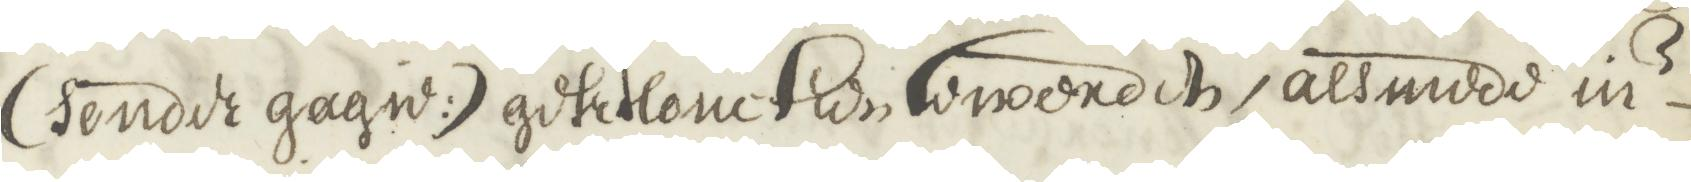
(sonder gagie:) gekloncken tewerden, als mede in
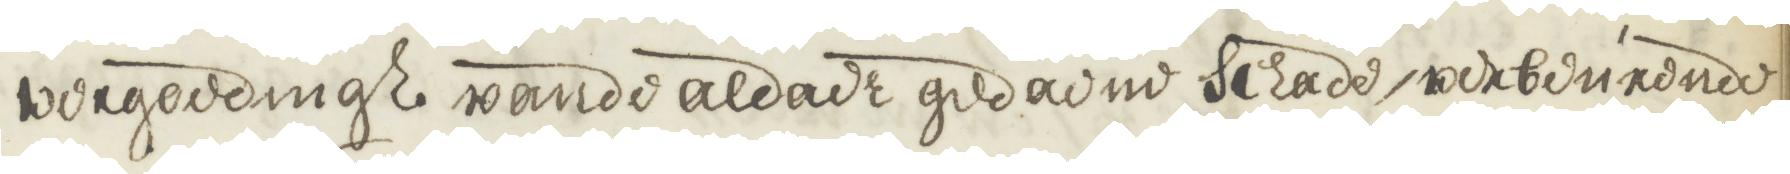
vergoedingh vande aldaer gedaene schade, verbeurende
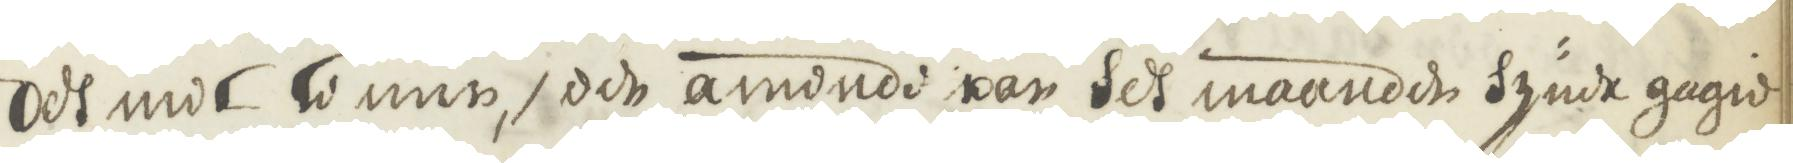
des niet te min, / een amende van ses maanden sijner gagie
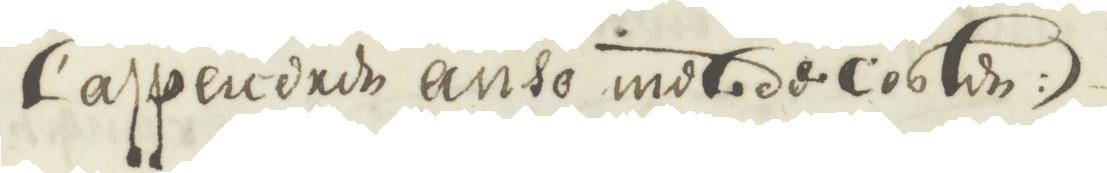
t' appliceren anso met de costen:)
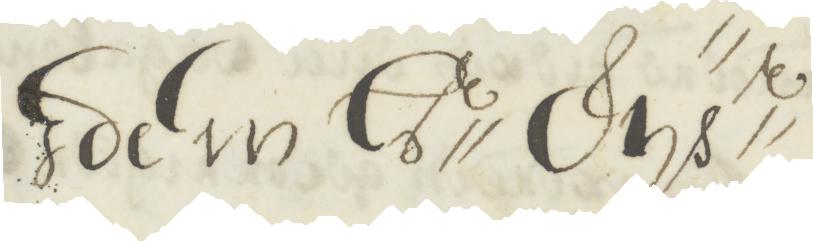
Idem H„r Eijs„r
